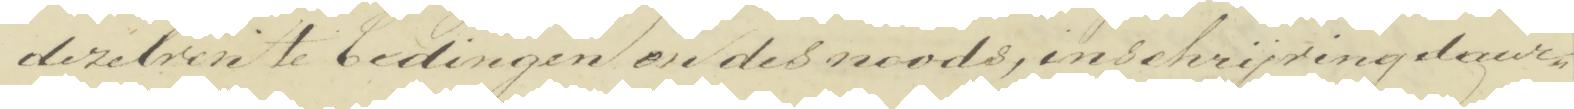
dezelven te bedingen en des noods, inschrijving daar„
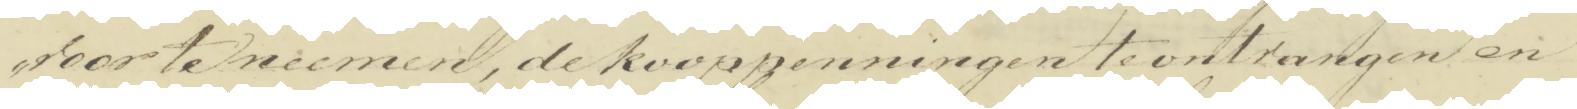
„voor te neemen, de kooppenningen te ontvangen en
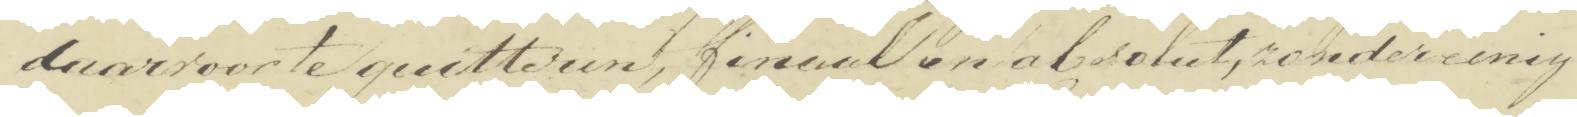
daarvoor te quitteren, finaal en absolut, zonder eenig
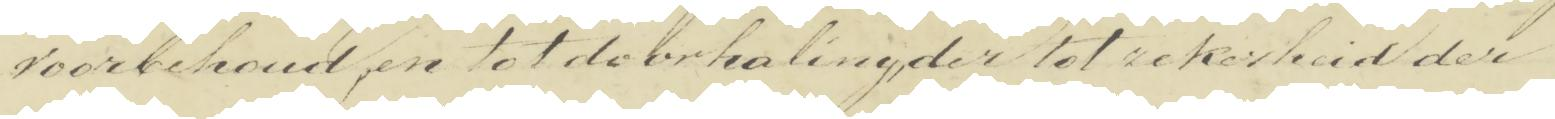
voorbehoud, en tot doorhaling, der tot zekerheid der
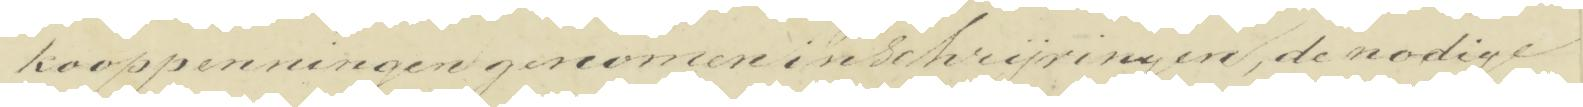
kooppenningen genomen inschrijvingen, de nodige
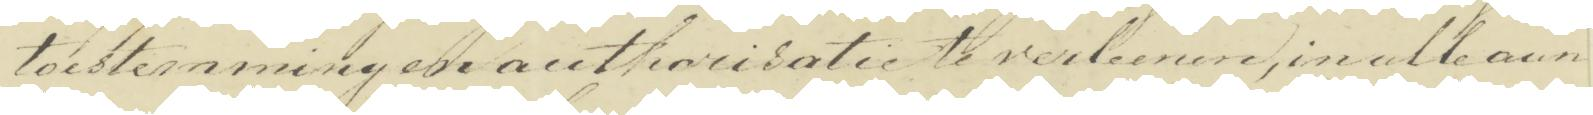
toestemming en authorisatie te verleenen, in alle aan
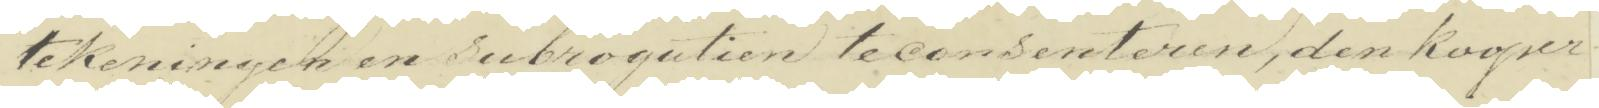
tekeningen en subrogatien te consenteren, den kooper
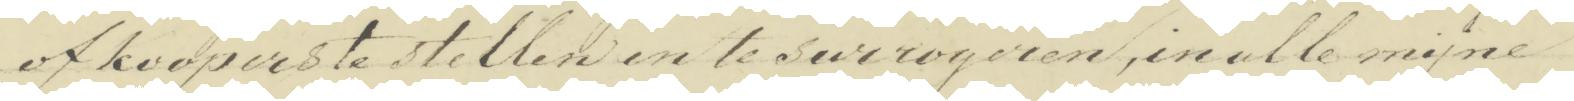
of koopers te stellen en te surrogeren, in alle mijne
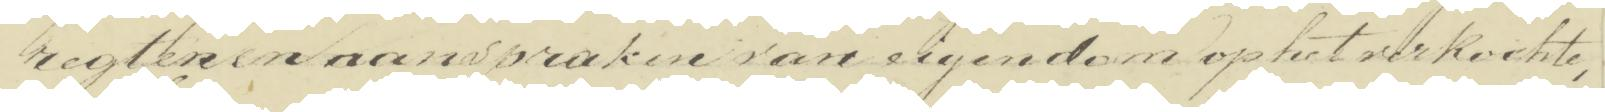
regten en aanspraken van eigendom op het verkochte,
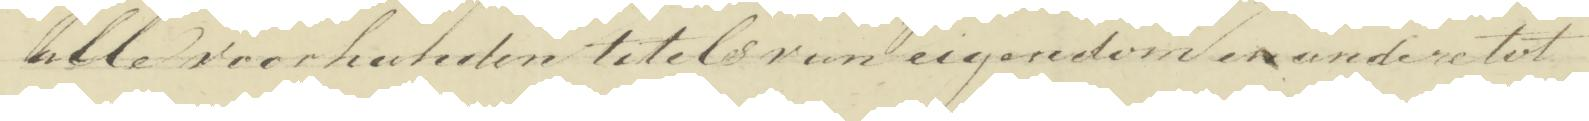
alle voorhanden titels van eigendom en andere tot
